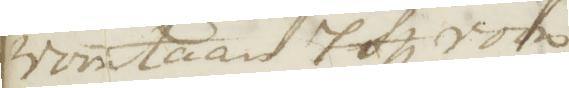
voortaan 7 st/ voor
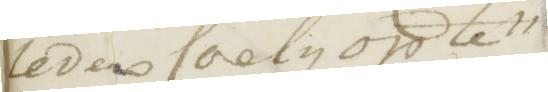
ieder Coelij op te
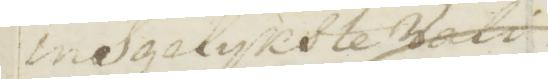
insgelijks te vali
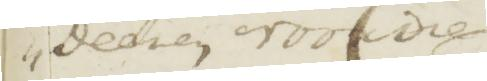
„deren voor die
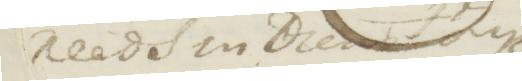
reeds in Dienst zyn
